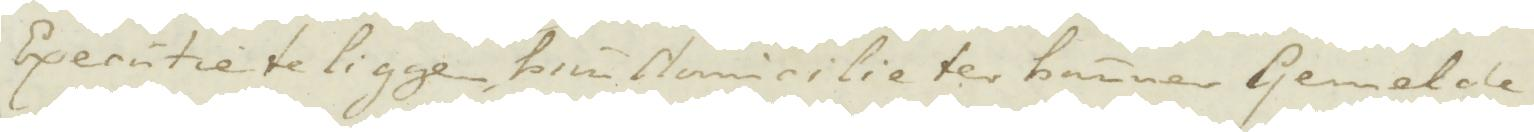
Executie te liggen, hun domicilie ter hunner Gemelde
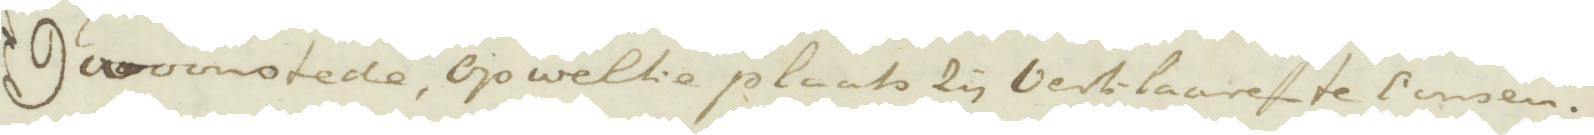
woonstede, Op welke plaats Zij verklaaren te consen.
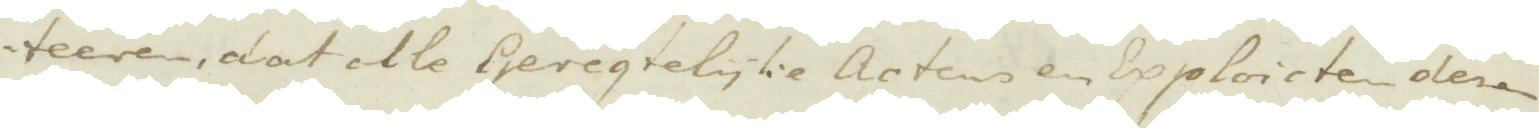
„teeren, dat alle Geregtelijke Actens en Exploicten dezen
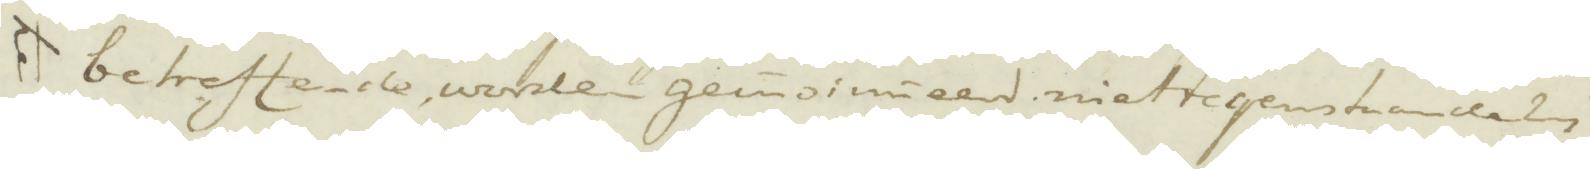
betreffende, worden geinsinueerd, niettegenstaande zij
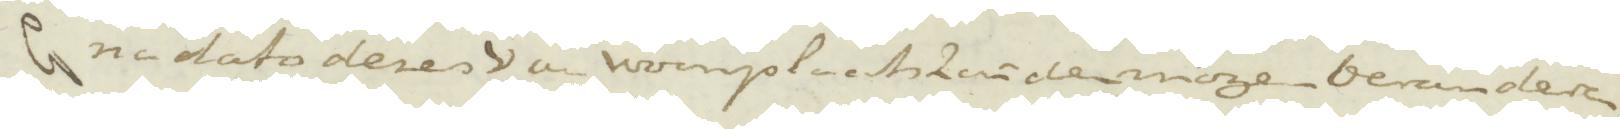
na dato dezes van woonplaats zouden mogen veranderen
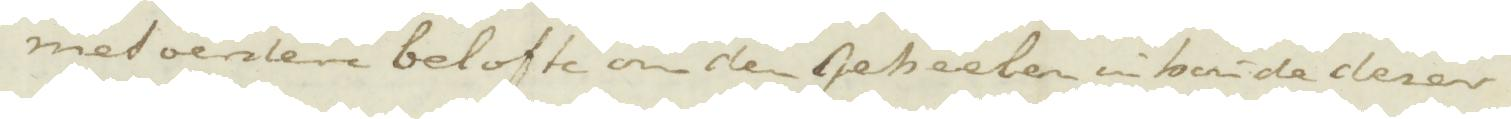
met verdere belofte om den Geheelen inhoude dezer
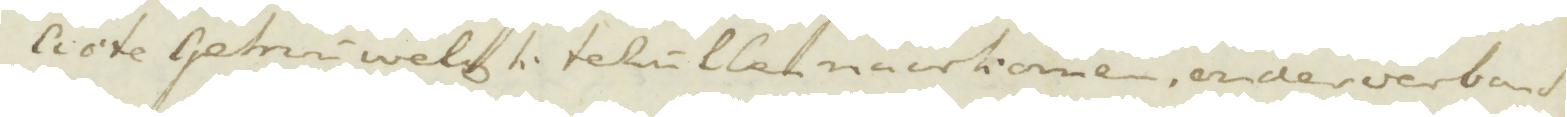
Acte Getrouwelyk te zullen naarkomen, onder verband
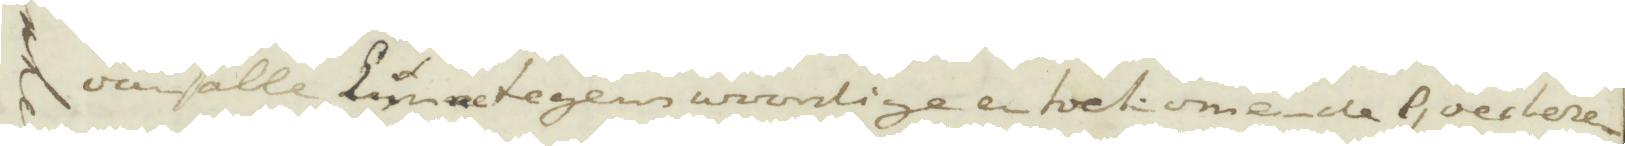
van alle hunne tegenswoordige en toekomende Goederen
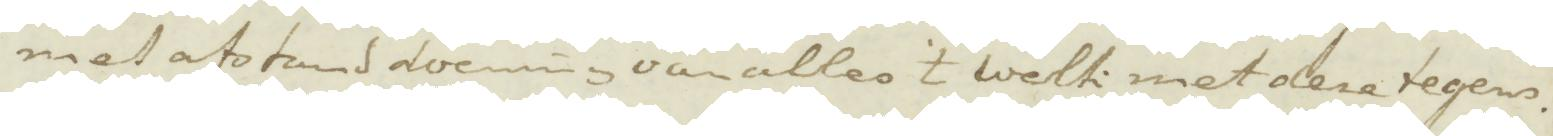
met afstanddoening van alles ’t welk met deze tegens
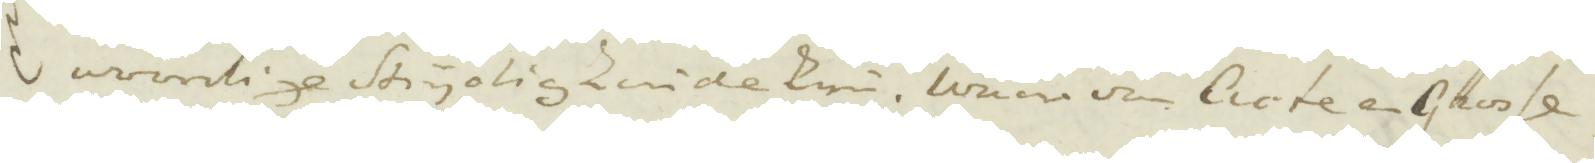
woordige strijdig Zoude Zijn, waarvan Acte en Grosse
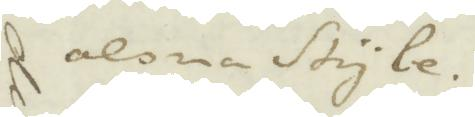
als na stijle.
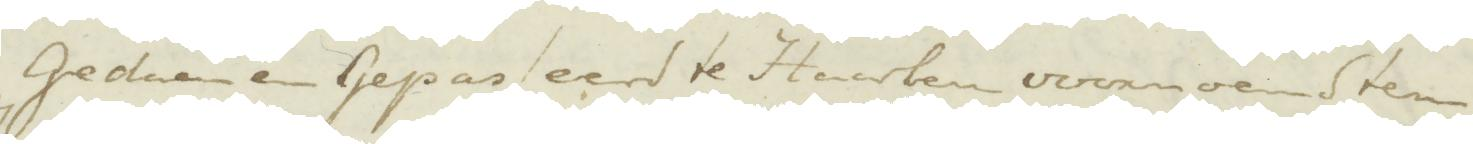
Gedaan en Gepasseerd te Haarlem voornoemd ten
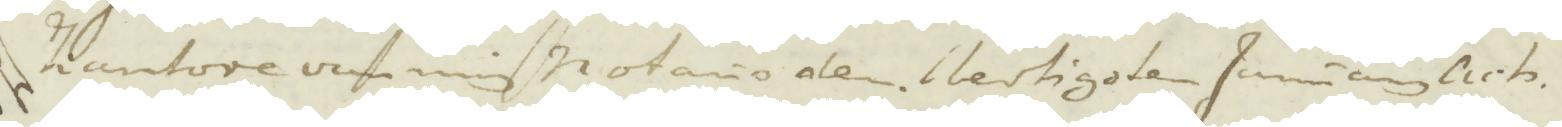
Kantore van mij Notaris den Dertigsten Januarij Ach.
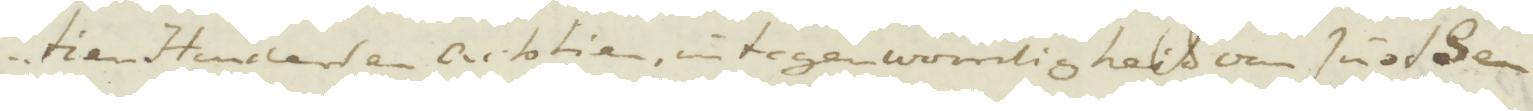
„tien Honderd en achtien, in tegenwoordigheid van Juns Hen
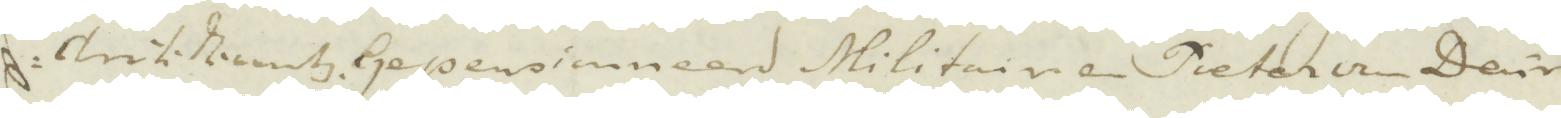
drik Kuntz, Gepensioneerd Militair en Pieter van Deur
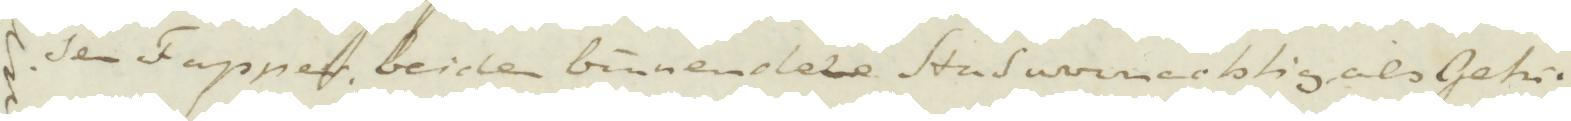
sen Tapper, beiden binnen deze stad woonachtig als Getui
